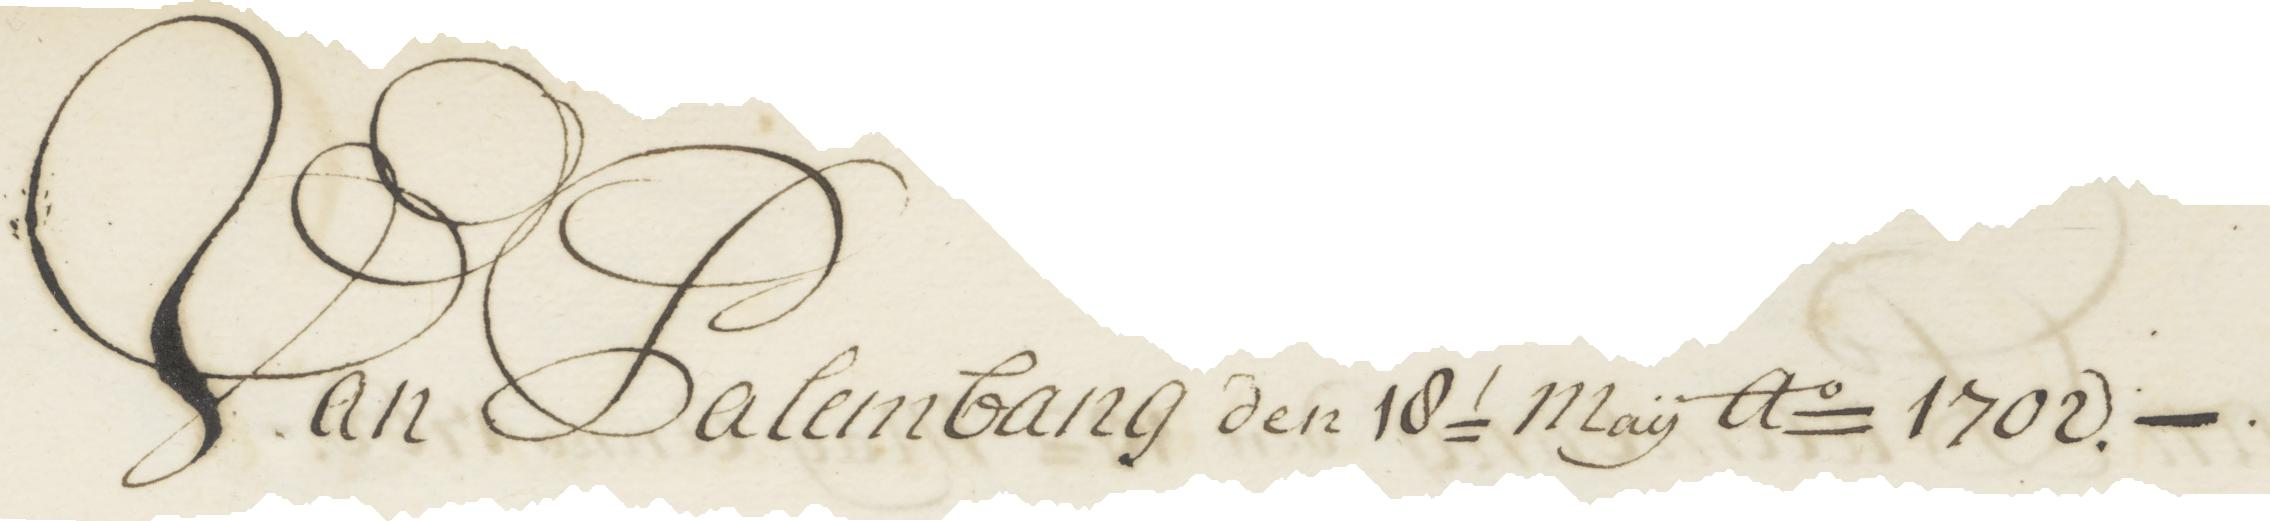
Van Palembang den 18=' Maij A=o 1702. —.
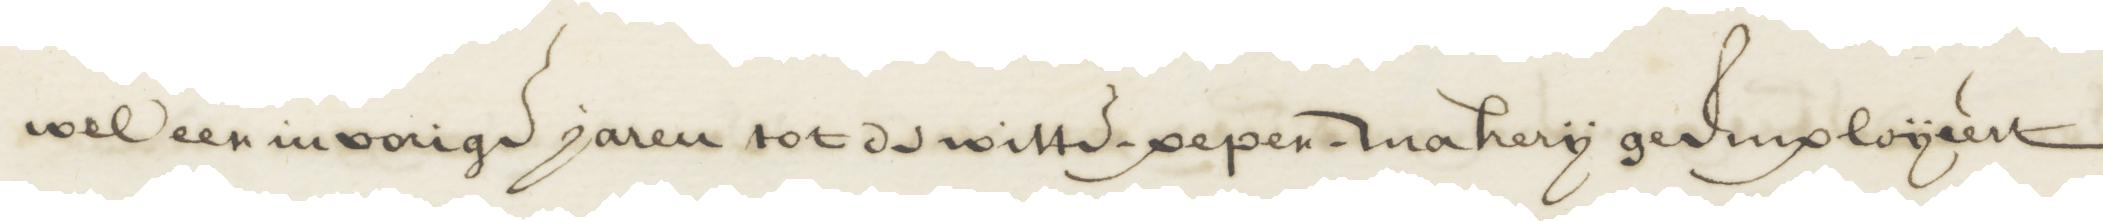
wel eer in vorige jaren tot de witte-peper-makerij geEmploijeert
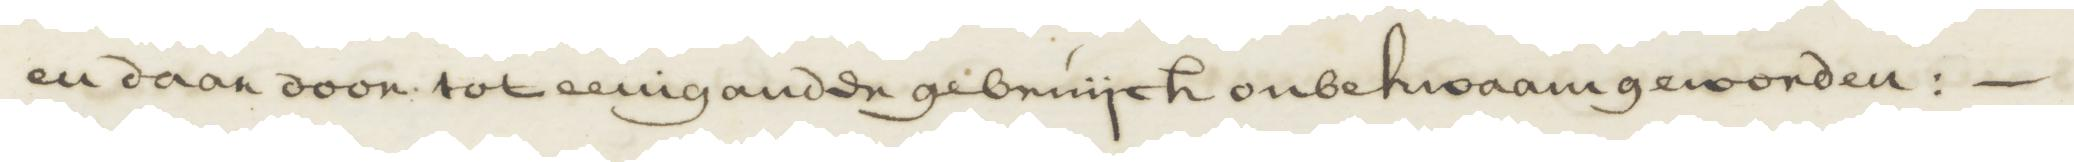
en daar door tot eenig ander gebruijck onbekwaam geworden: —
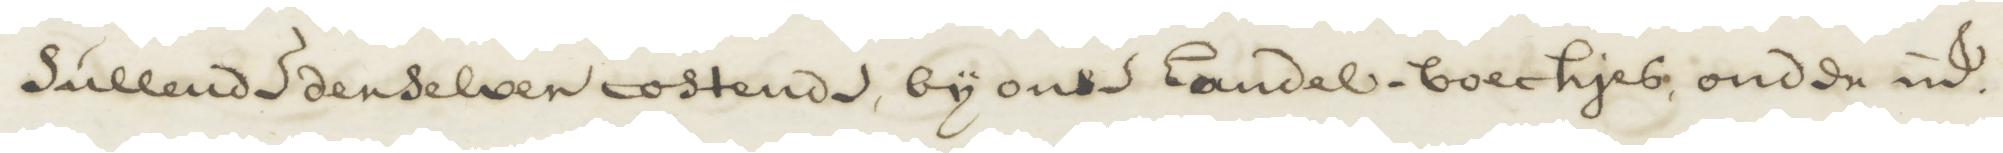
sullende derselver costende, bij onse handel-boeckjes, onder uE.
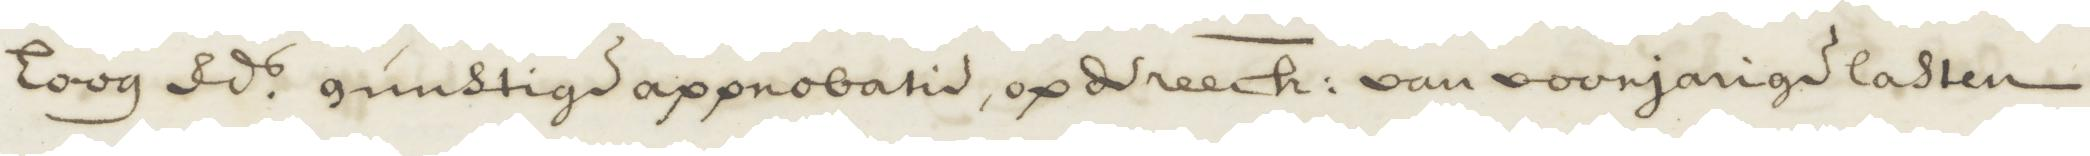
hoog Ed.s gunstige approbatie, op de reeck: van voorjarige lasten
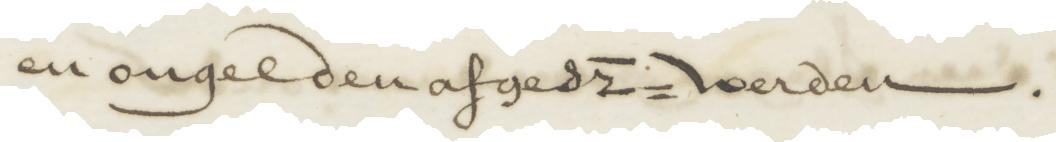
en ongelden afgesz= werden.
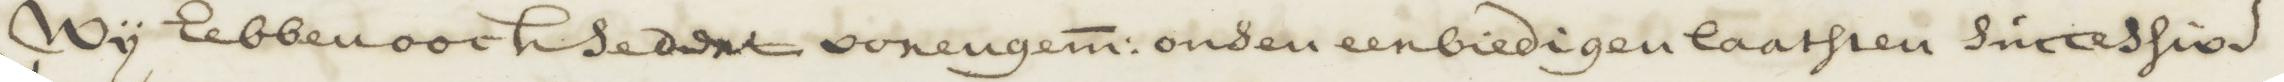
Wij hebben oock sedert vorengem: onsen eerbiedigen laatsten successive
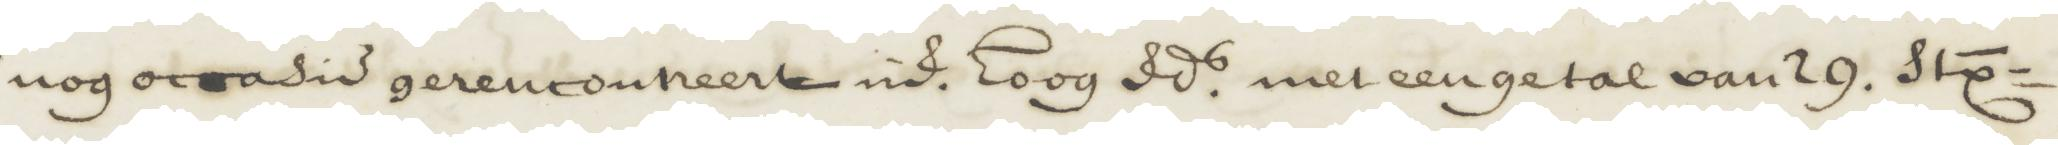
nog occasie gerencontreert uE. hoog Ed.s met een getal van 29. stx=
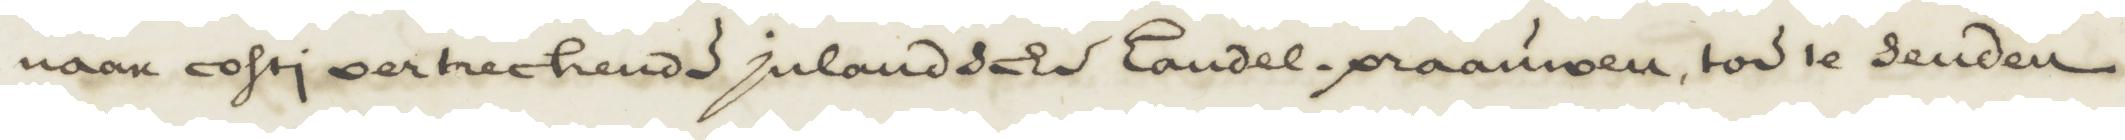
naar costj vertreckende jnlandsche handel-praauwen, toe te senden
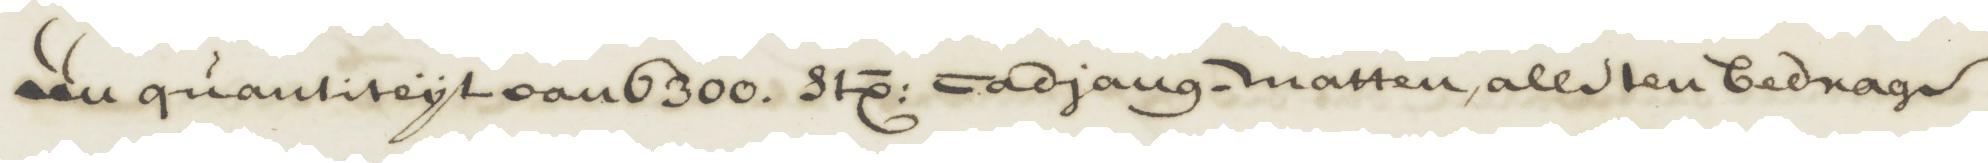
een quantiteijt van 6300. stx: cadjang-matten, alle ten bedrage
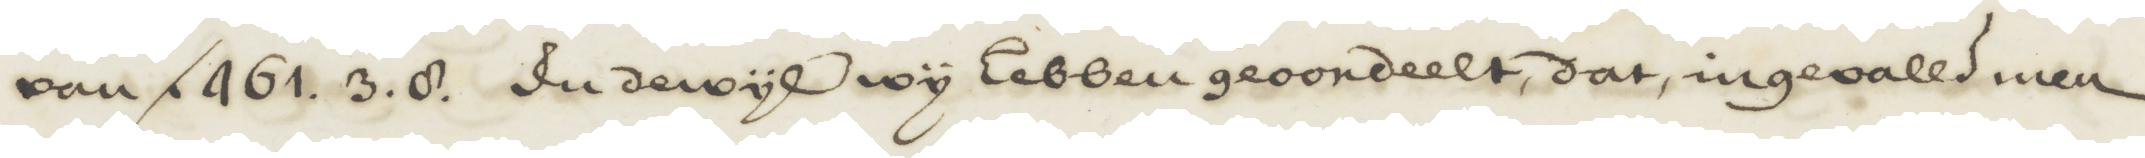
van ƒ 461. 3. 8. En dewijl wij hebben geoordeelt, dat, ingevalle men
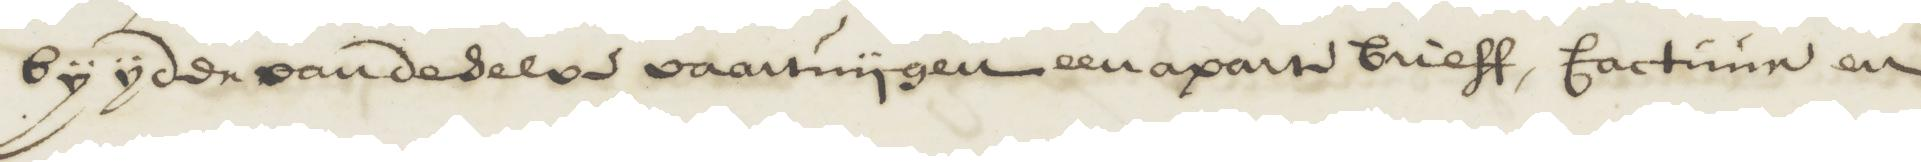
bij ijder van deselve vaartuijgen een aparte brieff, factuur en
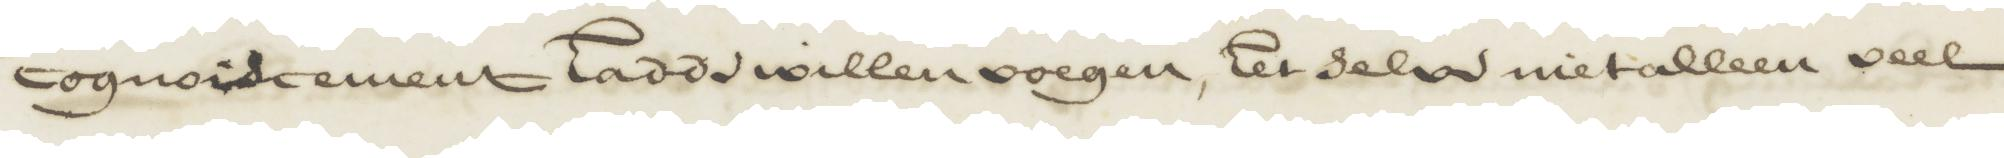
cognoiscement hadde willen voegen, het selve niet alleen veel
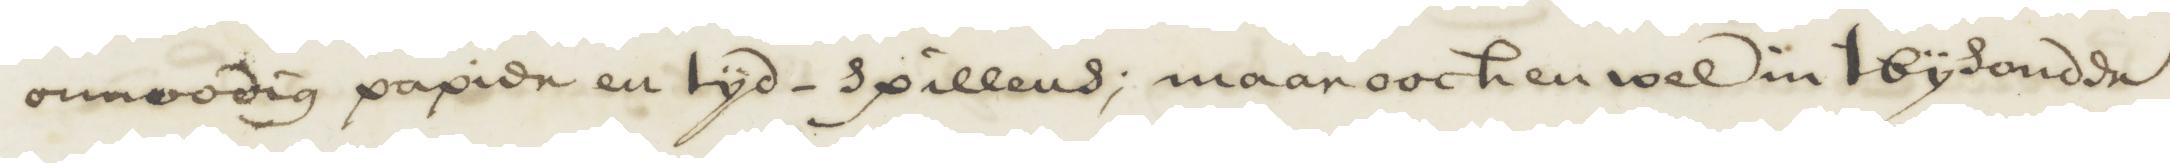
onnoodig papier en tijd-spillens; maar oock en wel in ’t bijsonder
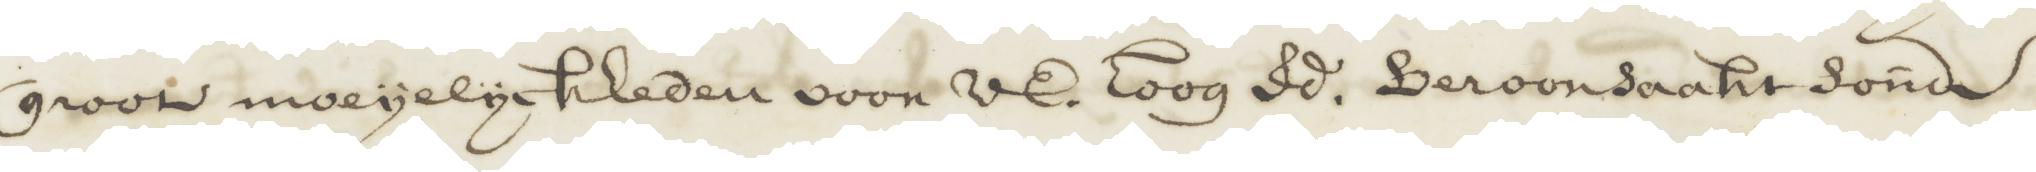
groote moeijelijckheden voor vE. hoog Ed. veroorsaakt soude
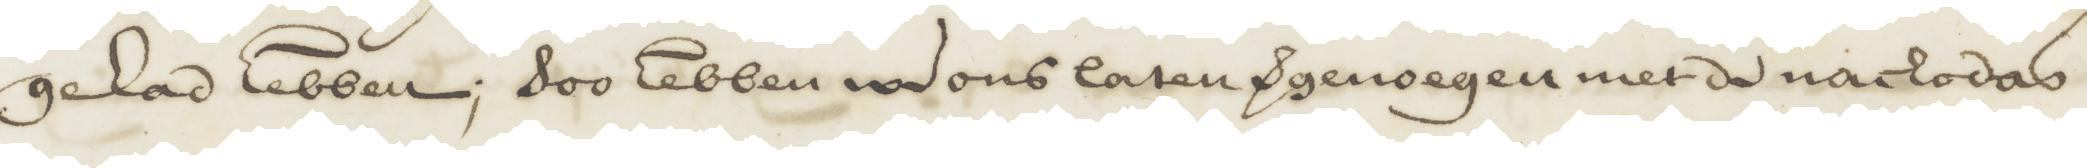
gehad hebben; soo hebben we ons laten vergenoegen met de nachodas
